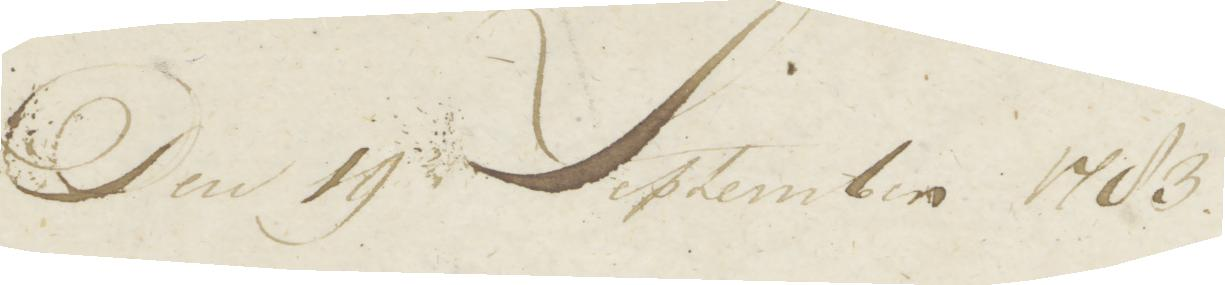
Den 19 September 1783.
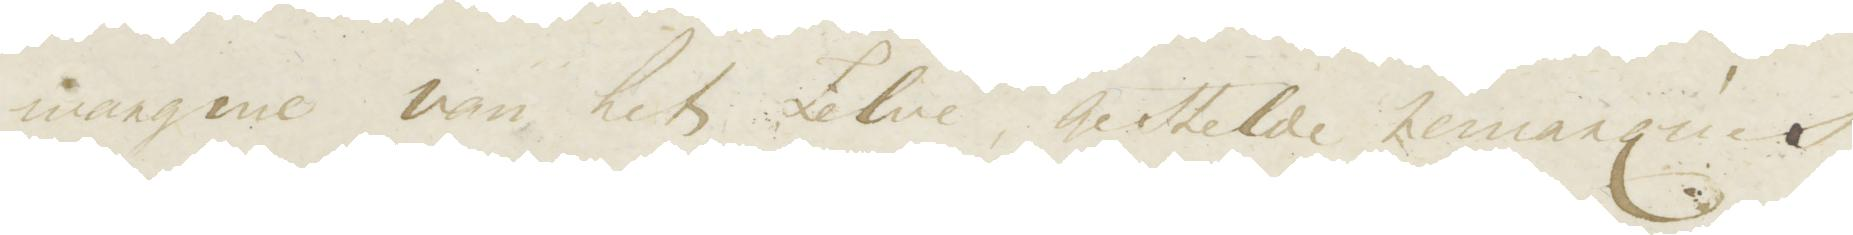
margine van het zelve, gestelde remarques
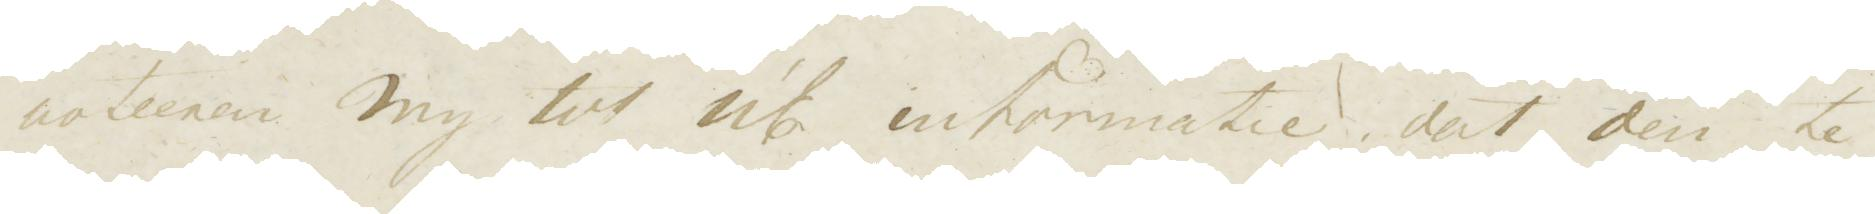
noteeren wy tot uE informatie, dat den te
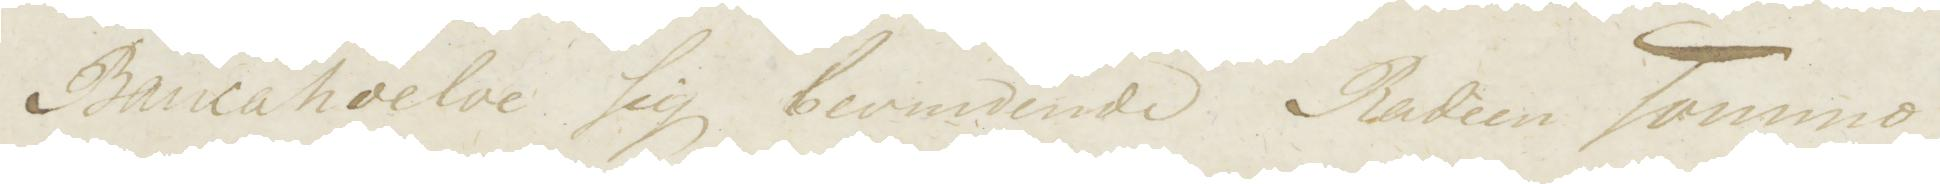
Bancahoeloe sig bevindende Radeen Tommo
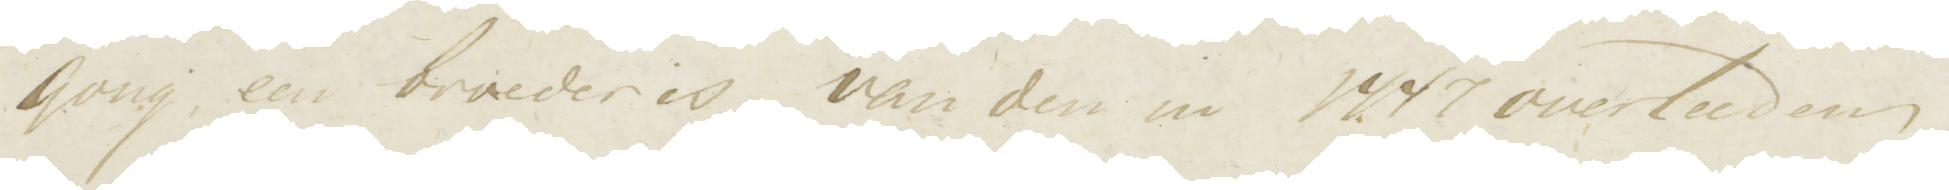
gong, een broeder is van den in 1777 overleeden
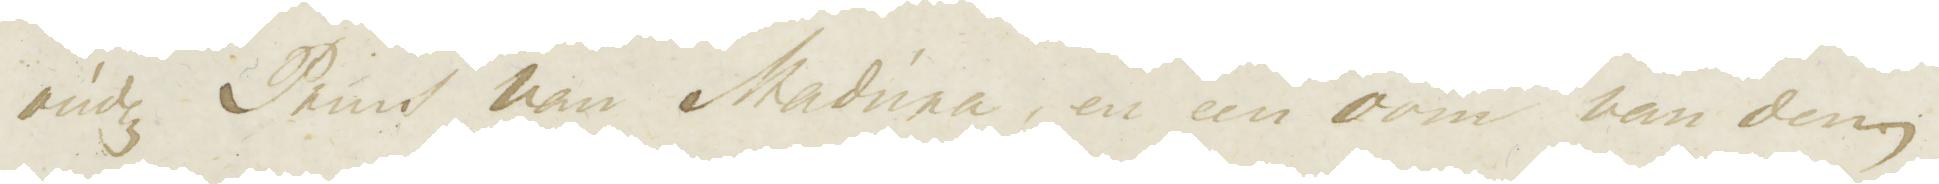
ouden Prins van Madura, en een oom van den
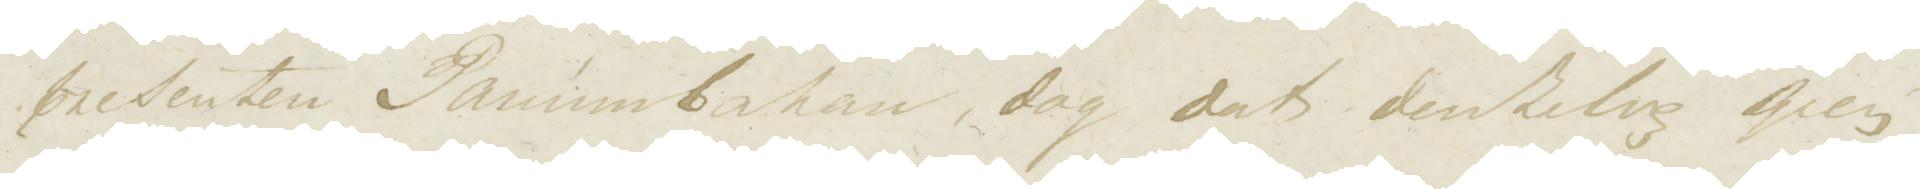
presenten Panumbahan, dog dat den zelven geen
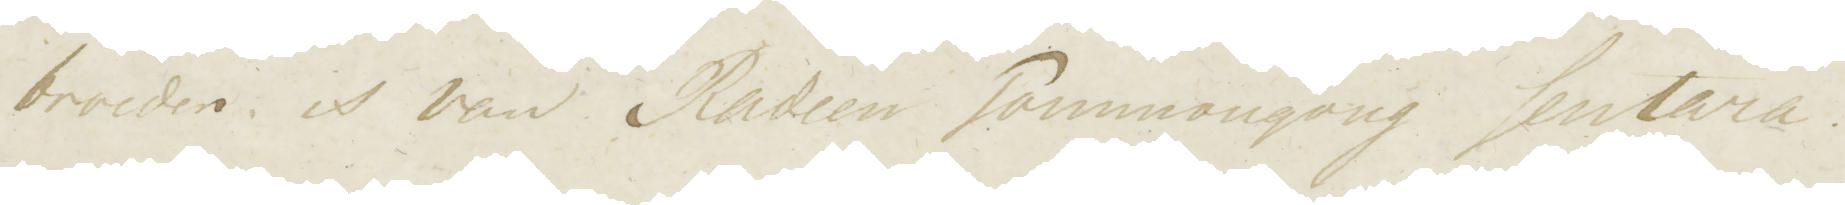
broeder is van Radeen Tommongong Sentara.
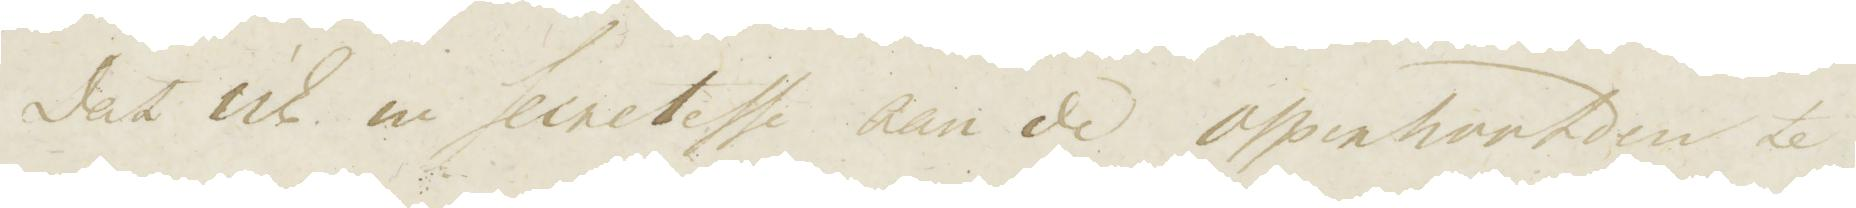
Dat uE. in secretesse aan de opperhoofden te
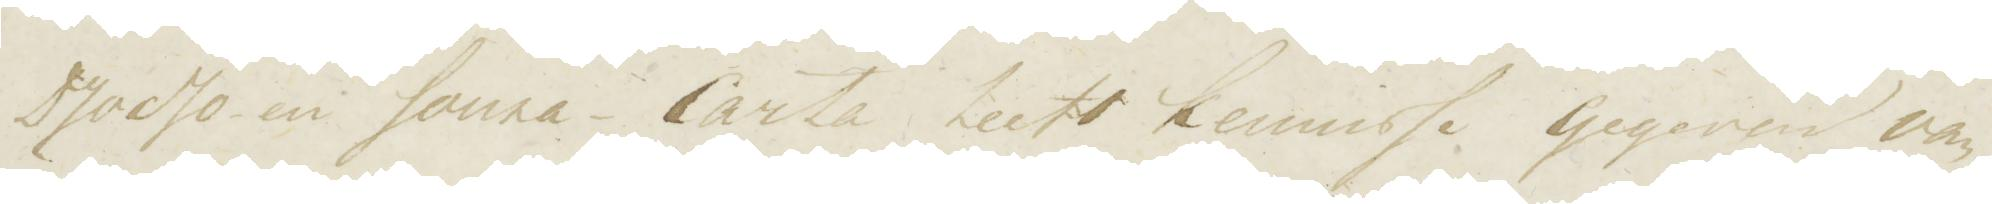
Djocjo en soura- Carta heeft kennisse gegeven van
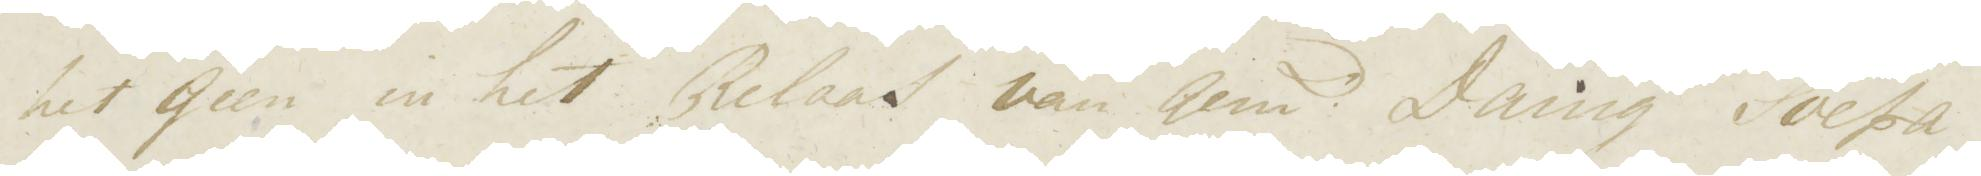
het geen in het Relaas van gem: Daing soepa
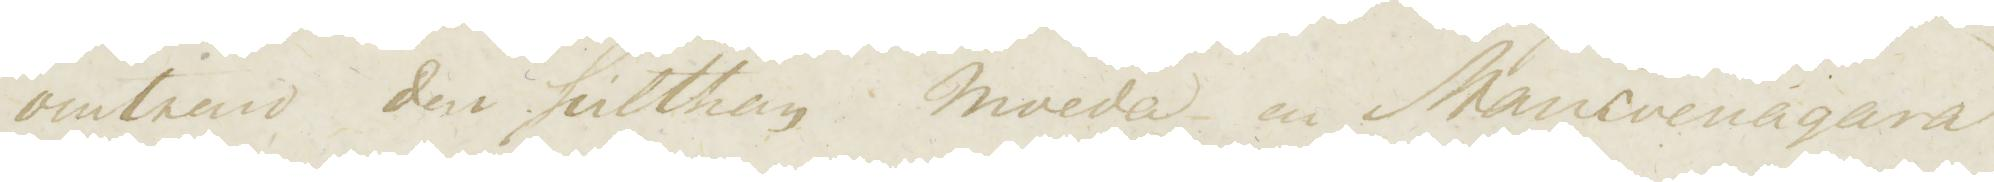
omtrend den sulthan moeda en Mancoenagara
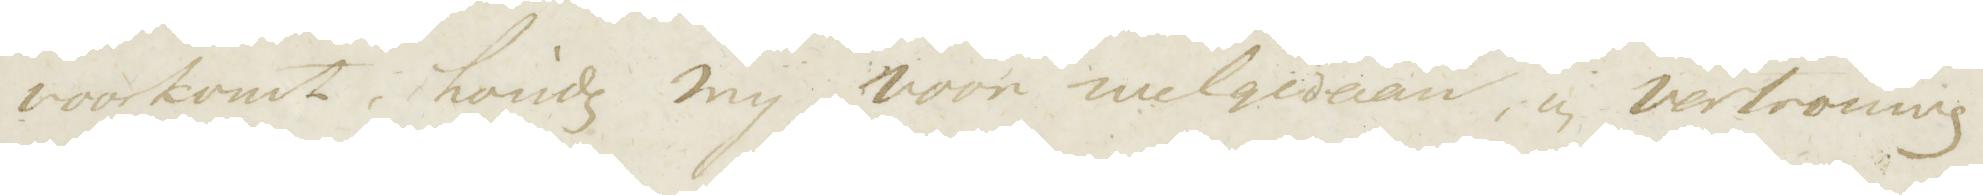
voorkomt, houden mij voor welgedaan, in vertrouwen
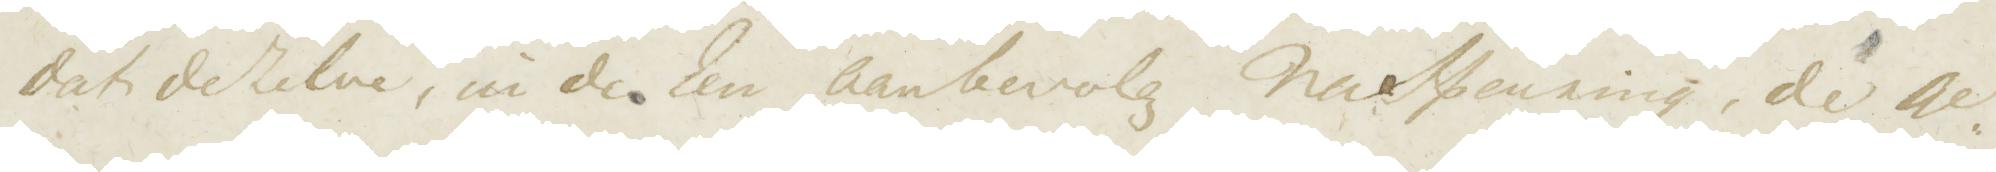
dat dezelve, in de hen aanbevolen naspeuring, de ge„
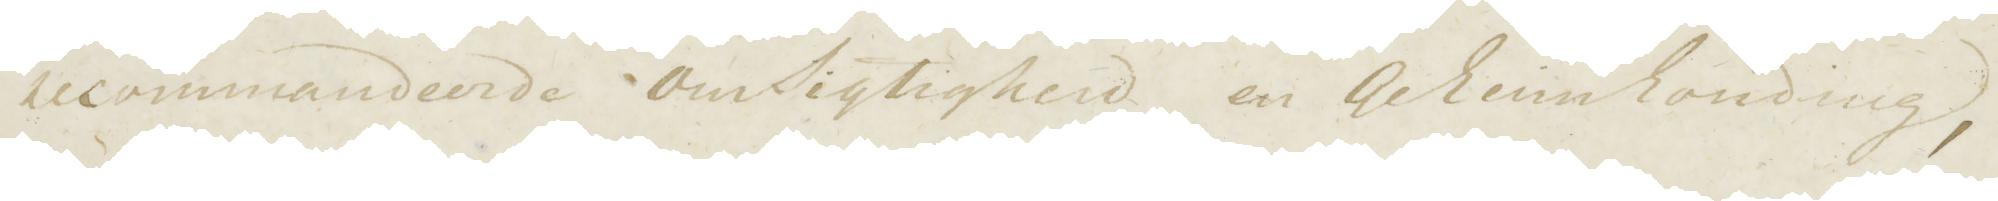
recommandeerde omsigtigheid en geheimhouding,
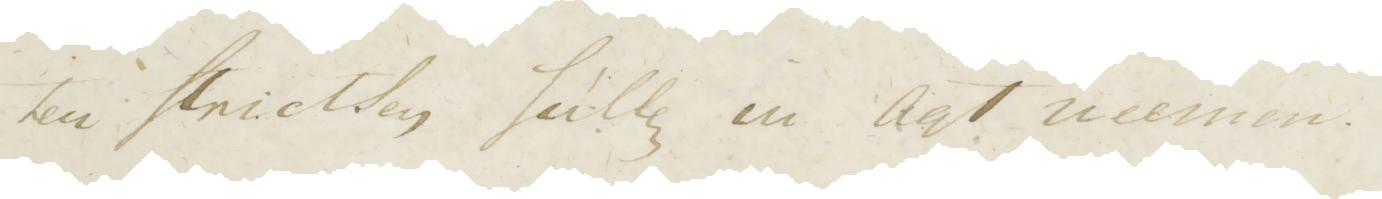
ten strictsen sullen in agt neemen.
